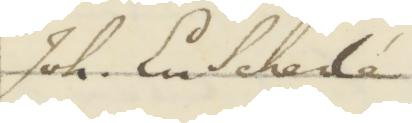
Joh. Enschedé
